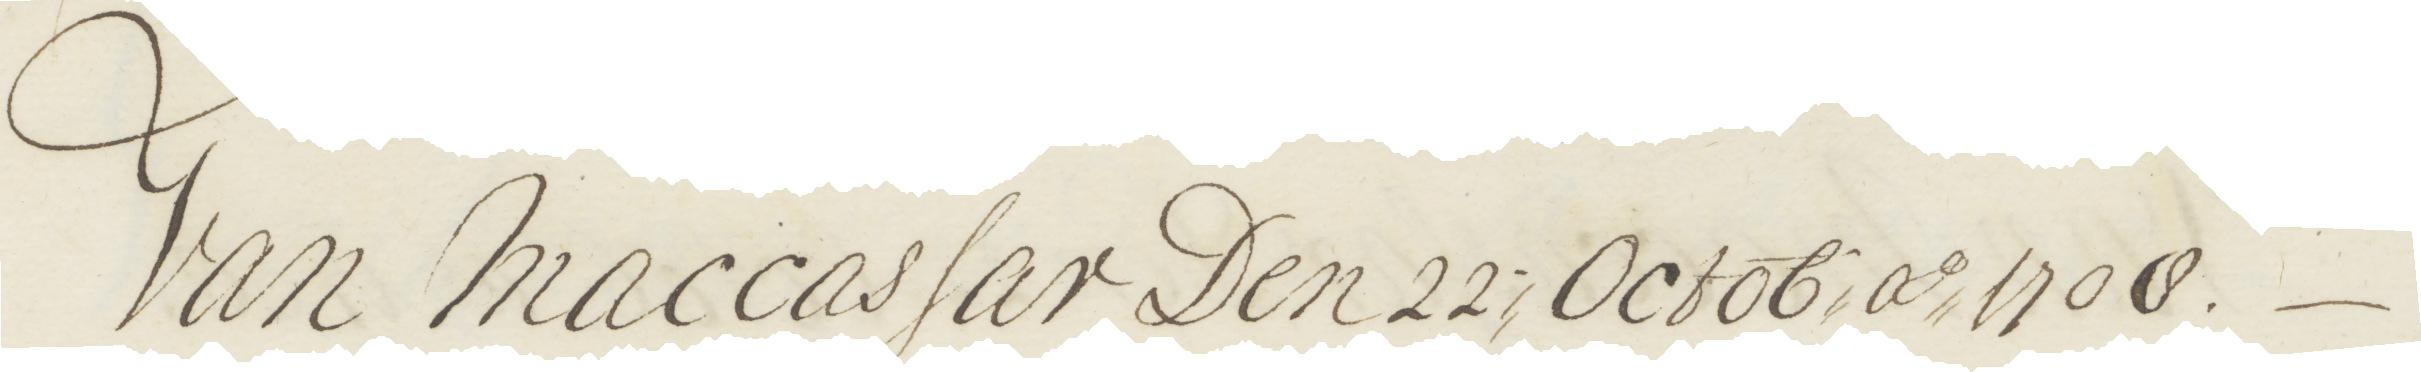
Van Maccassar Den 22„' Octob:' a„o 1708. —
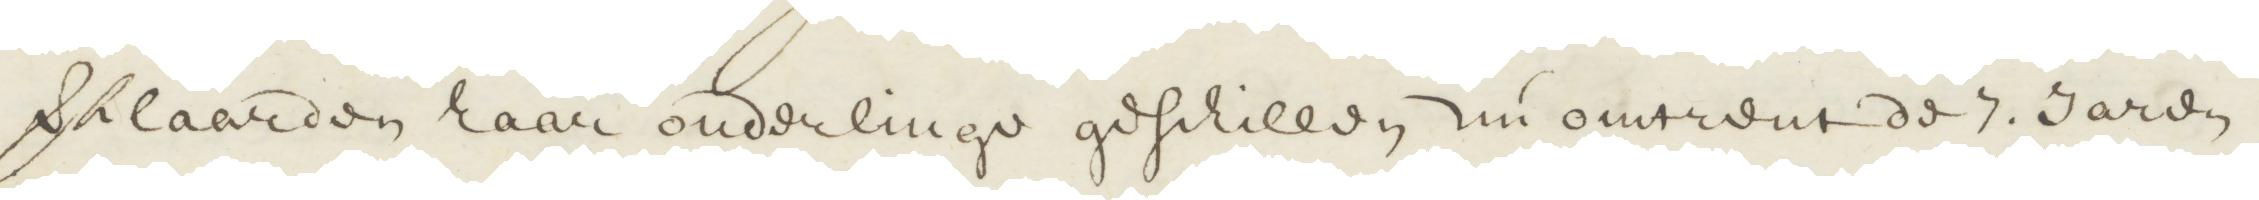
verklaarden haar onderlinge geschillen nu omtrent de 7. Iaren
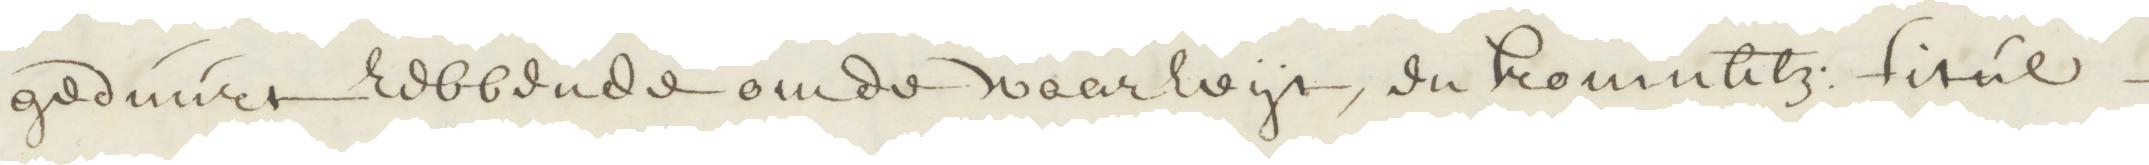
geduurt hebbende omde waarheijt, en koninklijk titul
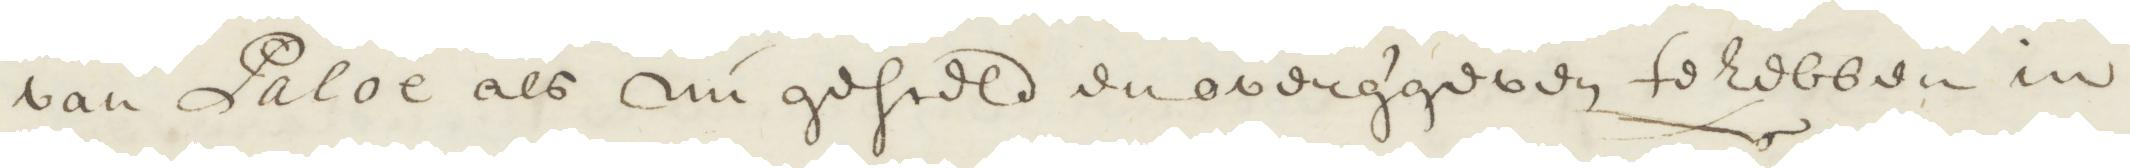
van Paloe als nu gesteld en overg’geven te hebben in
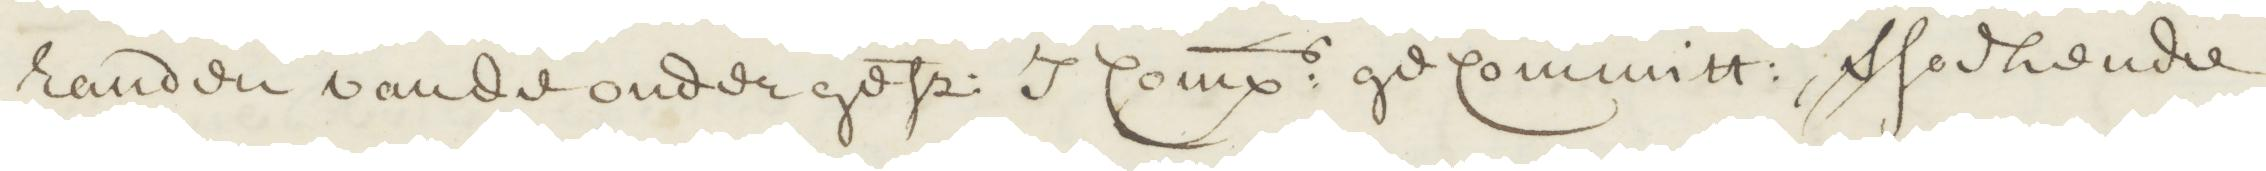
handen van de ondergesz: ’s Comp:s gecommitt:s, versoekende
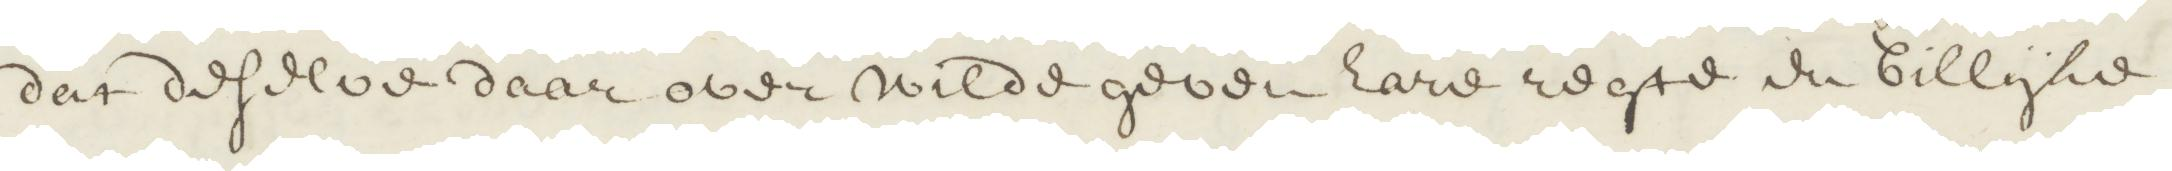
dat deselve daar over wilde geven hare regte en billijke
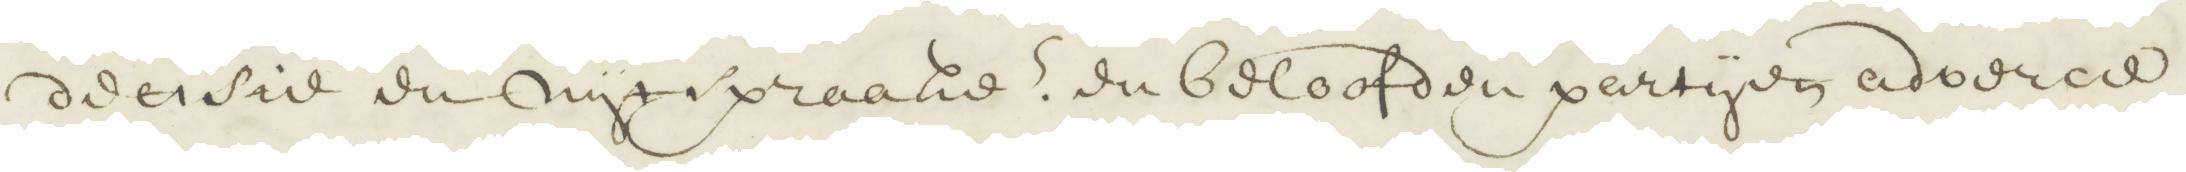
decisie en uijtspraake! en beloofden partijen advercie
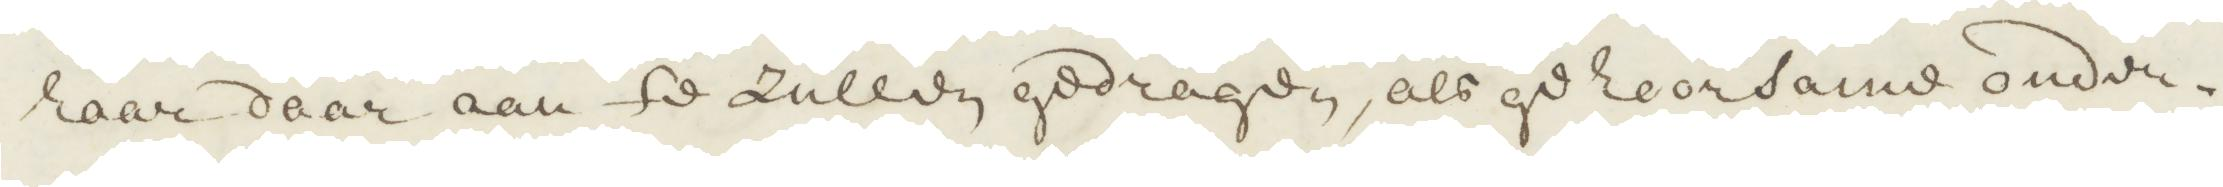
haar daar aan te zullen gedragen, als gehoorsame onder„
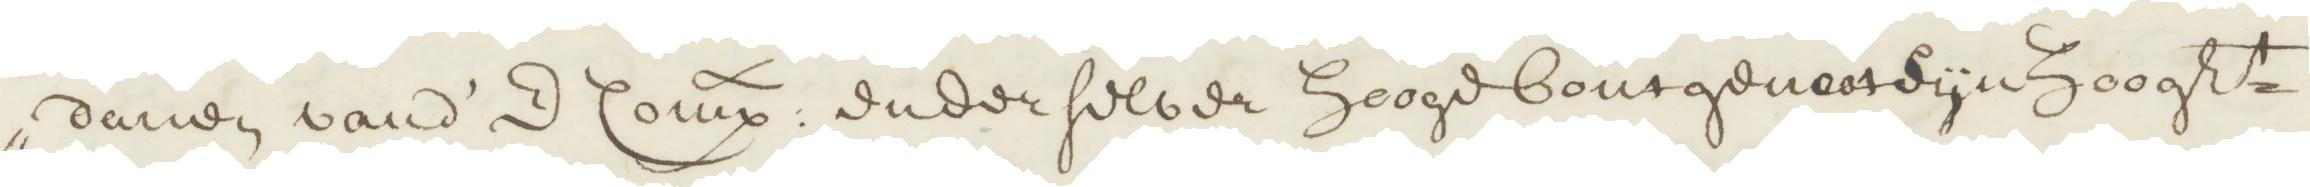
„danen vand’ E Comp: en derselver hooge bontgenoot sijn Hoogh=t
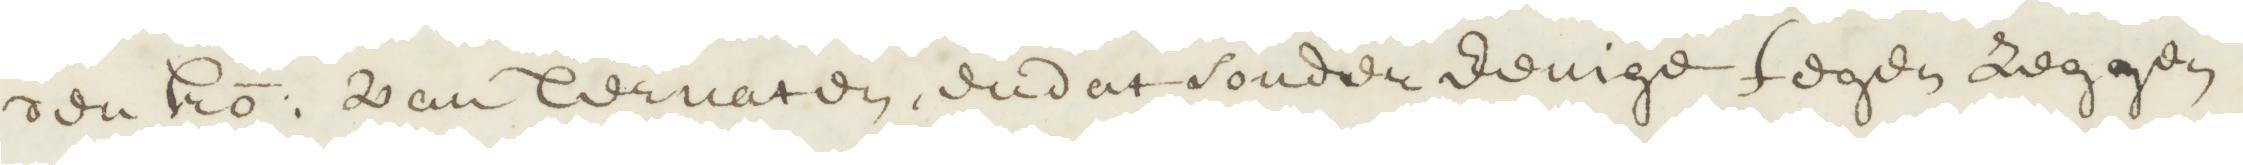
den ko: van Ternaten, en dat sonder Eenige tegen zeggen
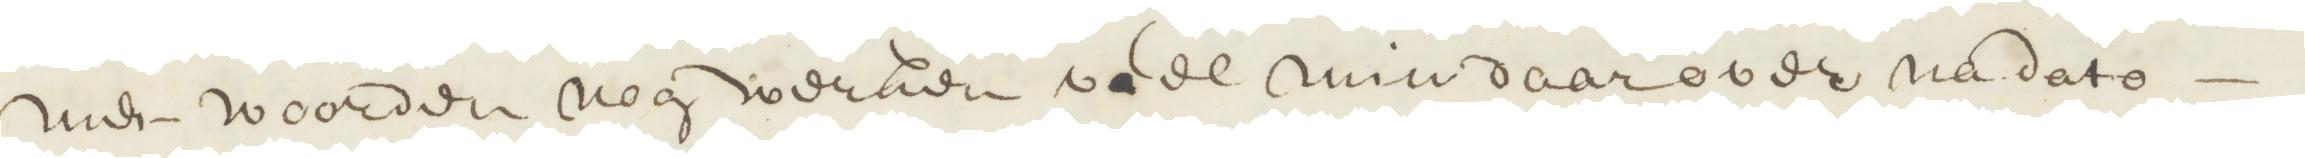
met woorden nog werken veel min daarover na dato —
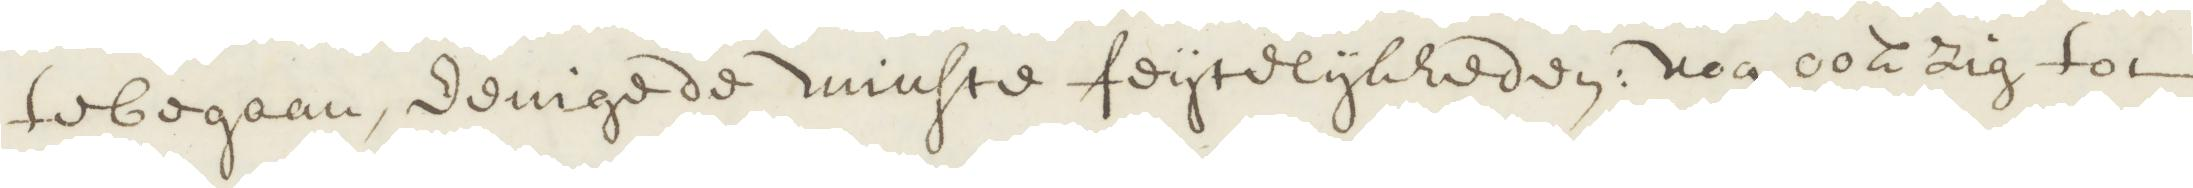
te begaan, Eenige de minste feijtelijkheden: nog ook zig tot
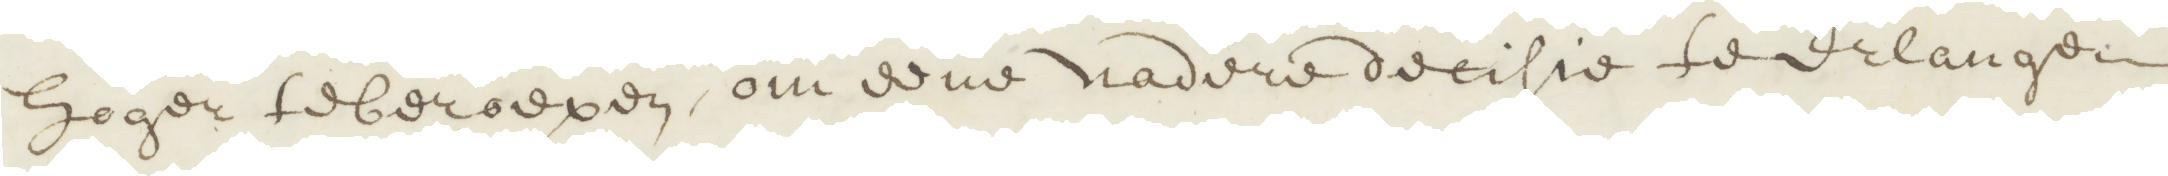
hoger te beroepen, om eene nadere decisie te Erlangen
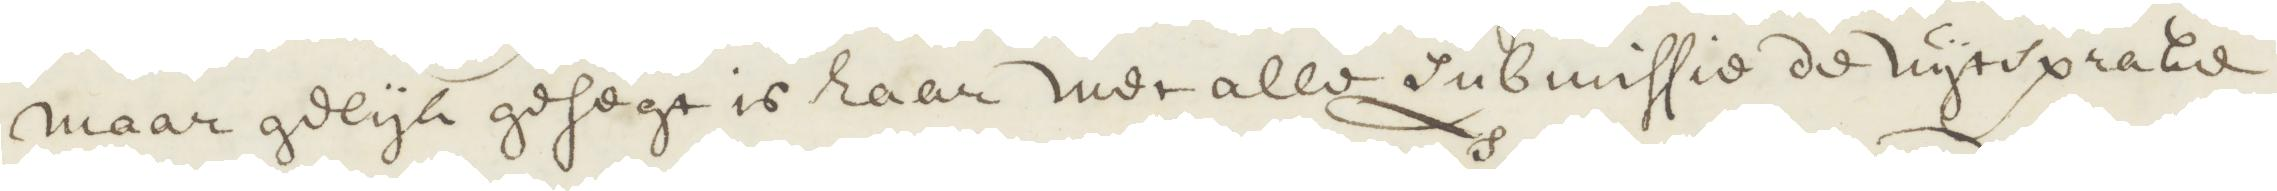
maar gelijk gesegt is haar met alle submissie de uijtsprake
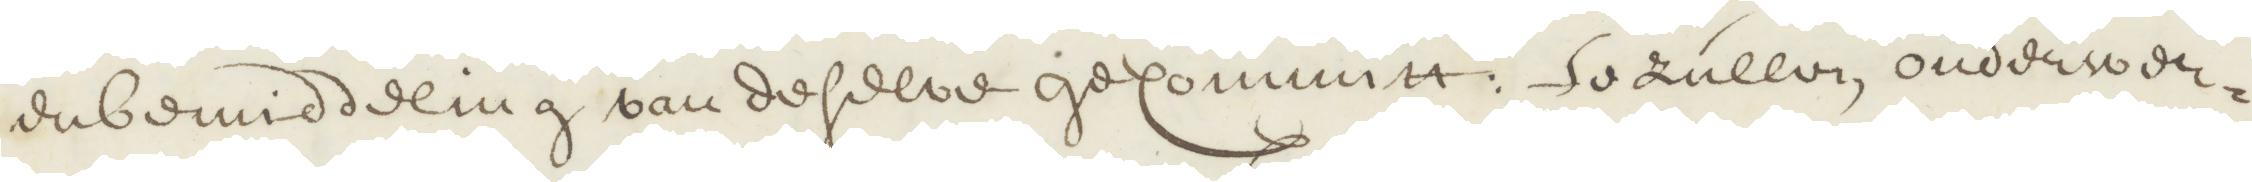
en bemiddeling van deselve gecommitt:s te zullen onderwer=
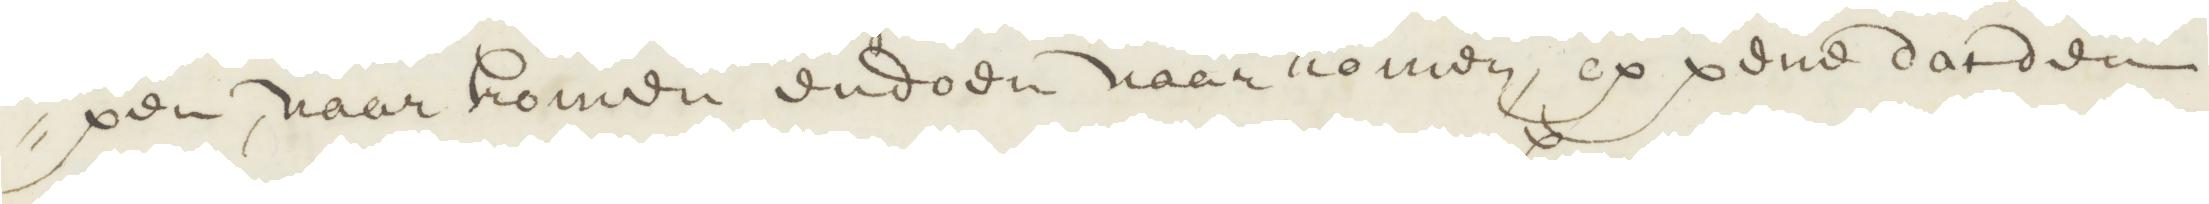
„pen, naar komen en doen naar komen, op pene dat den
